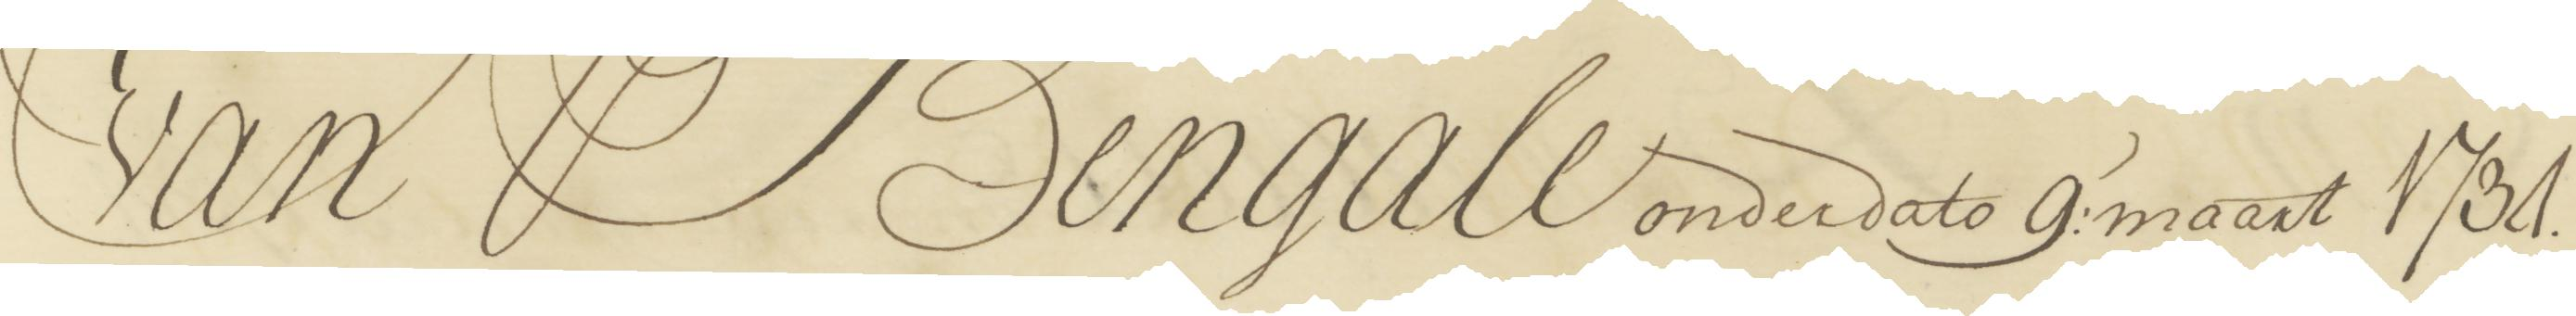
Van Bengale onder dato 9' maart 1734.
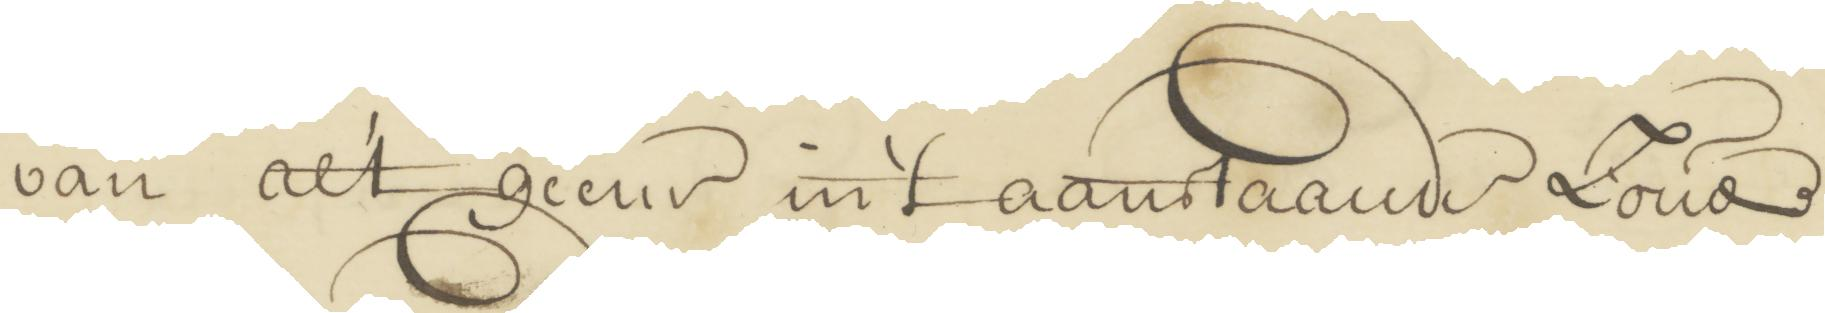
van al't geene in ’t aanstaande Zoude
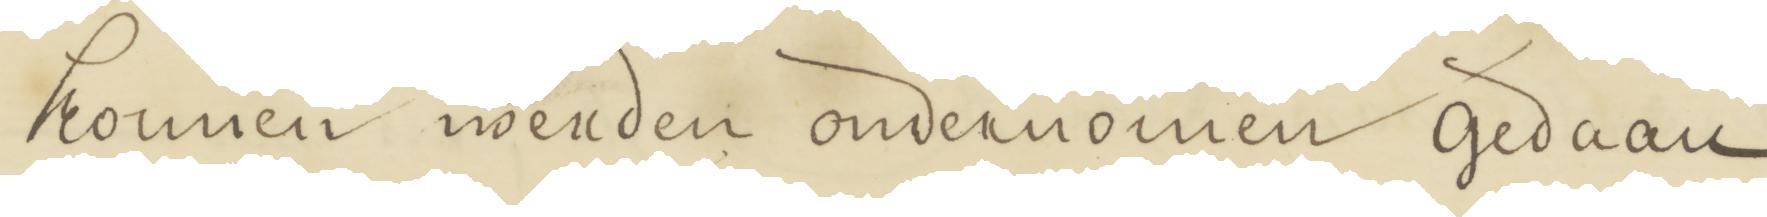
konnen werden ondernomen gedaan
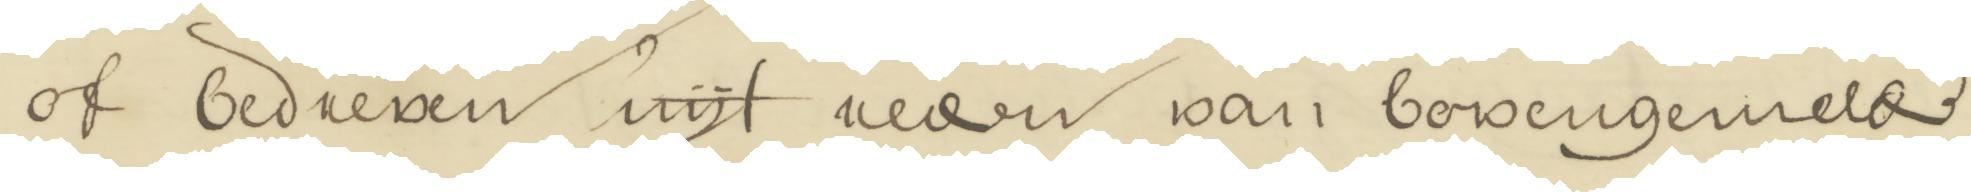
of bedreven uijt reden van bovengemelde
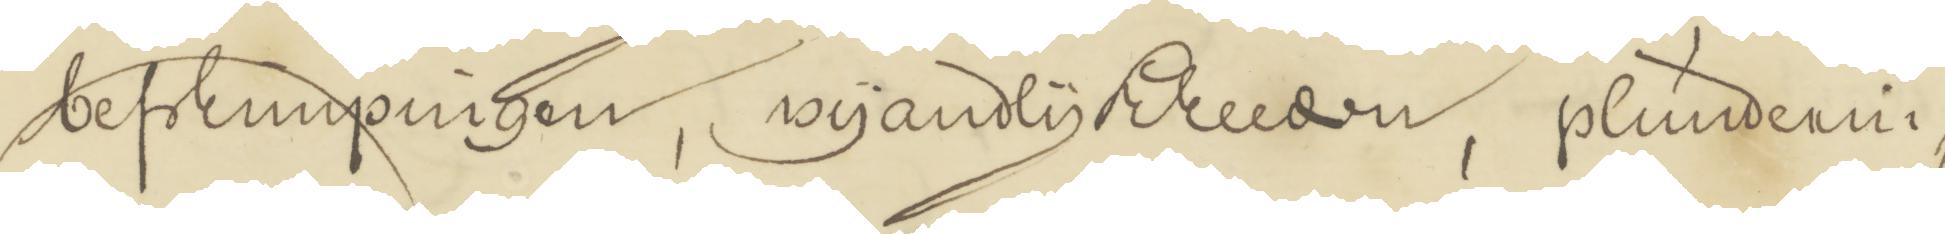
beschimpingen, vijandlijkheeden, plunderin
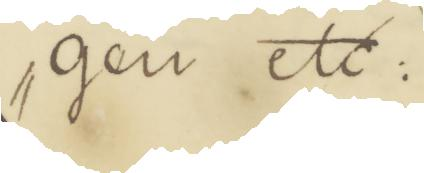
„gen etc:
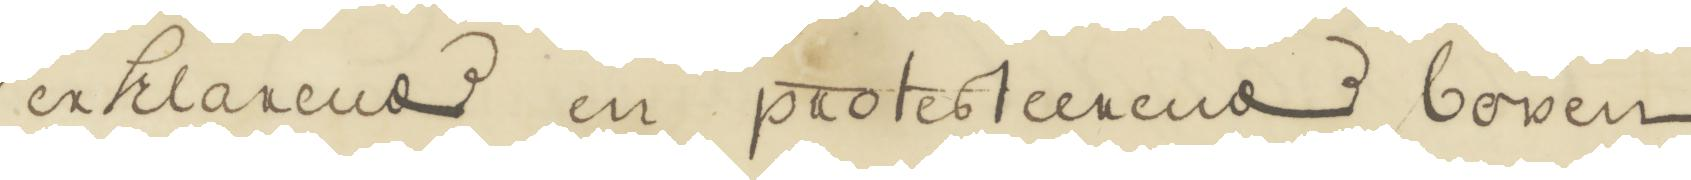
Verklarende en protesteerende boven
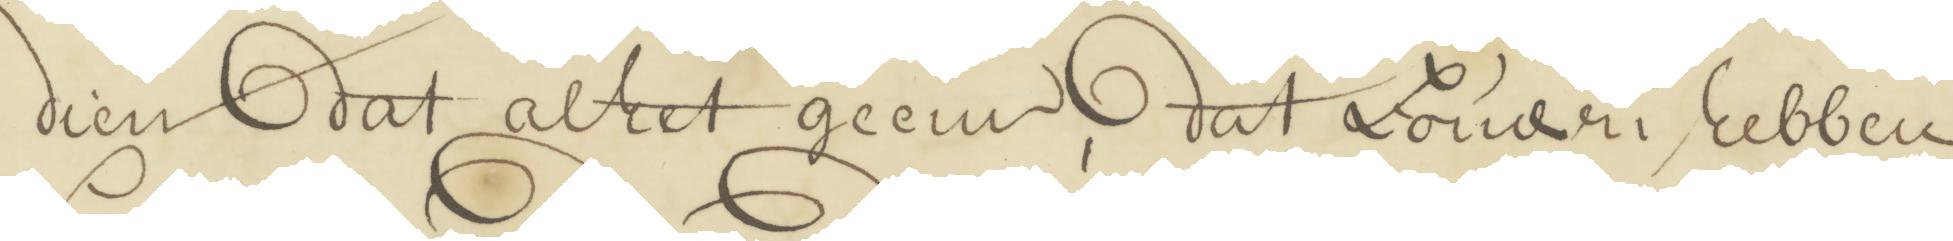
dien dat al het geene dat Zouden hebben
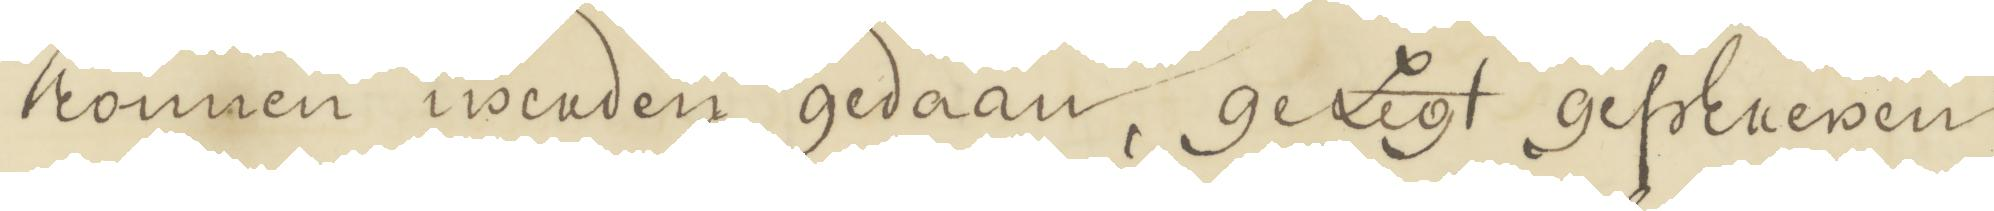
konnen werden gedaan, gezegt geschreven
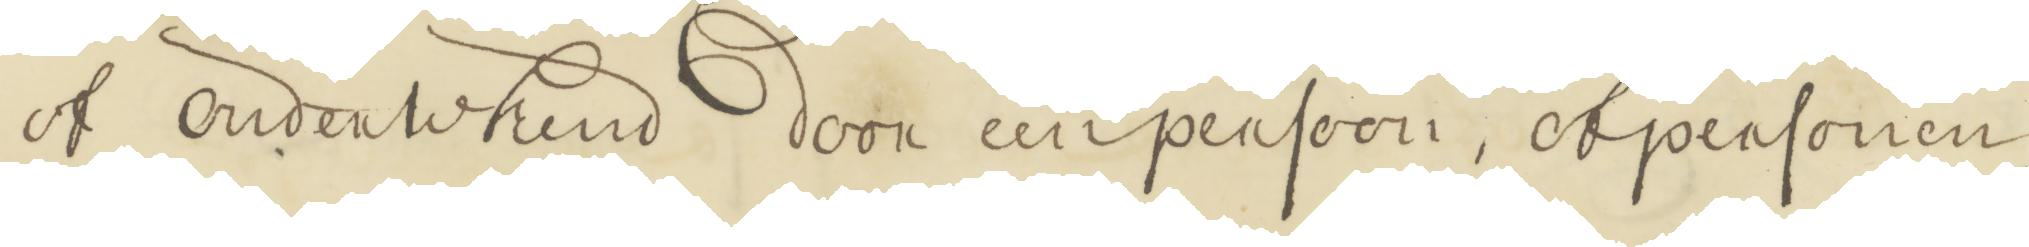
of ondertekend door een persoon, of personen,
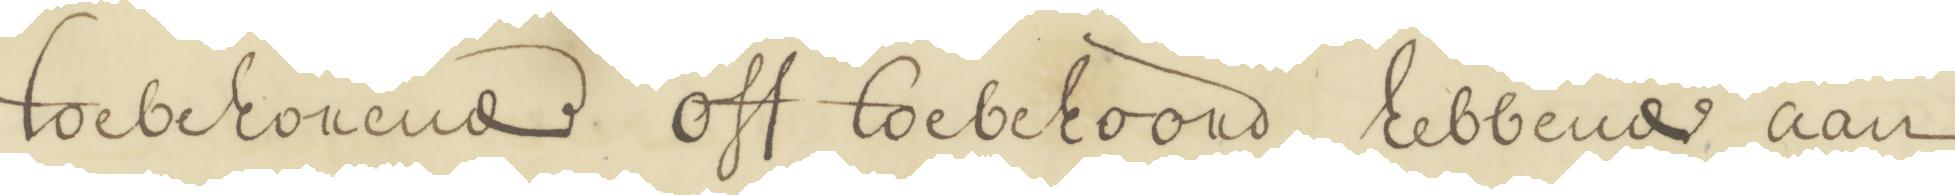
toebehorende off toebehoord hebbende aan
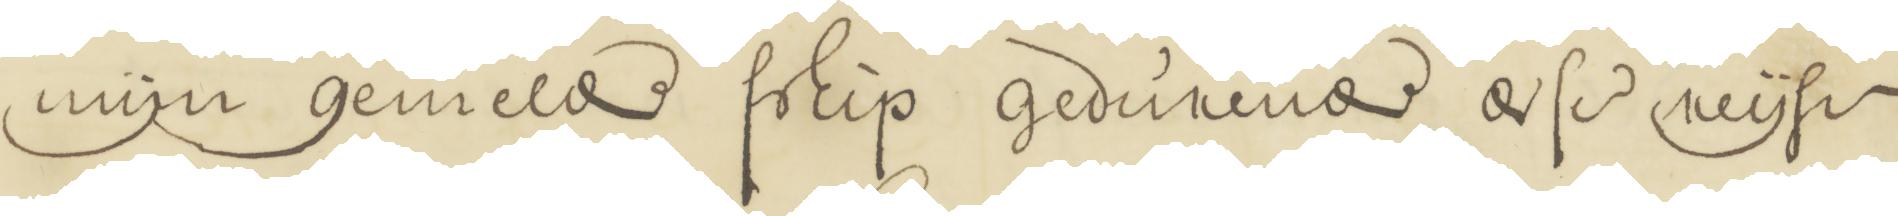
mijn gemelde schip gedurende dese reijse
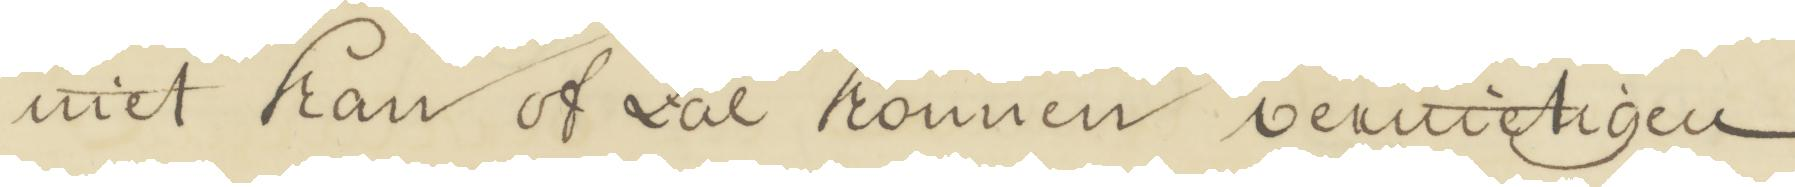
niet kan of Zal konnen vernietigen
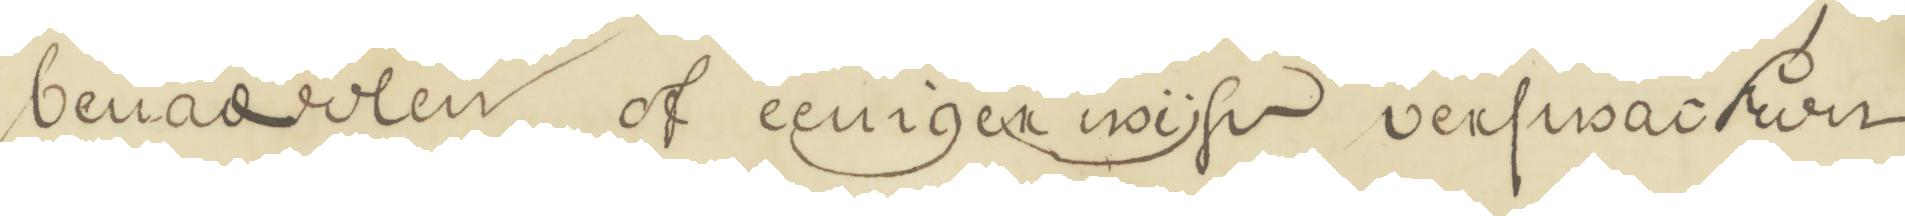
benadeelen of eeniger wijse verswacken
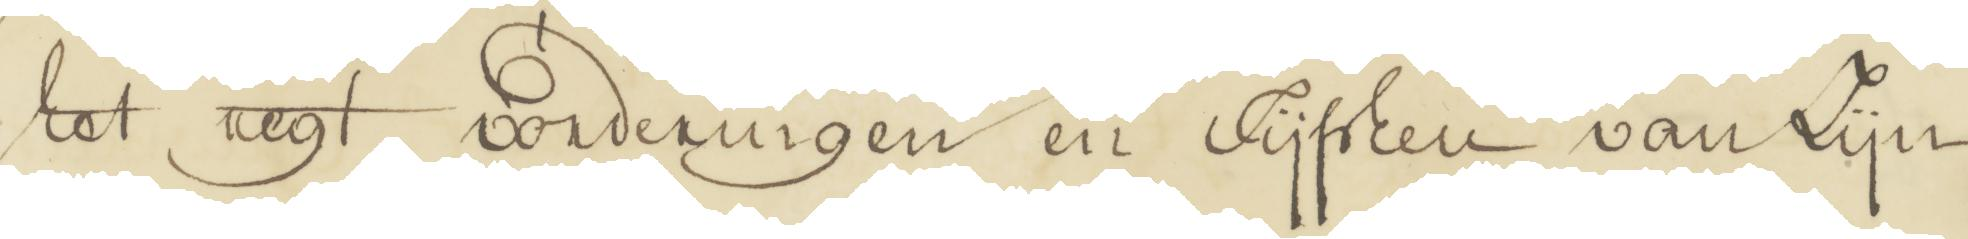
het regt, vorderingen en Eijschen van Zijn
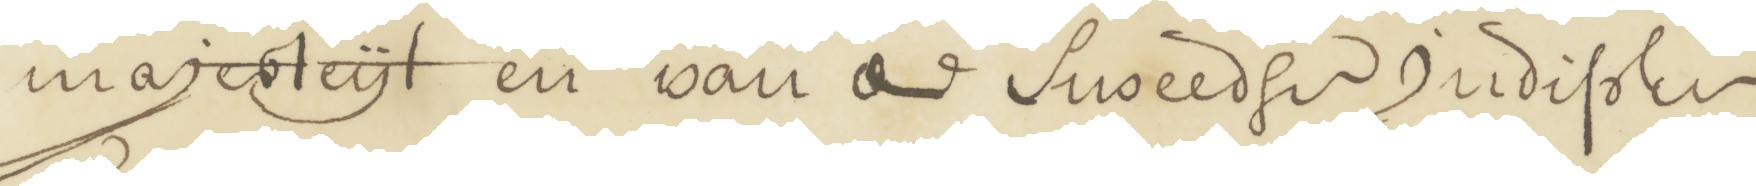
majesteijt en van de Sweedse Indische
